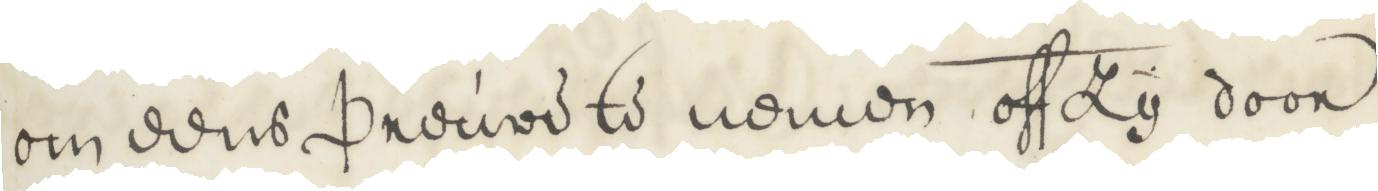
om eens Preuve te nemen off zij door
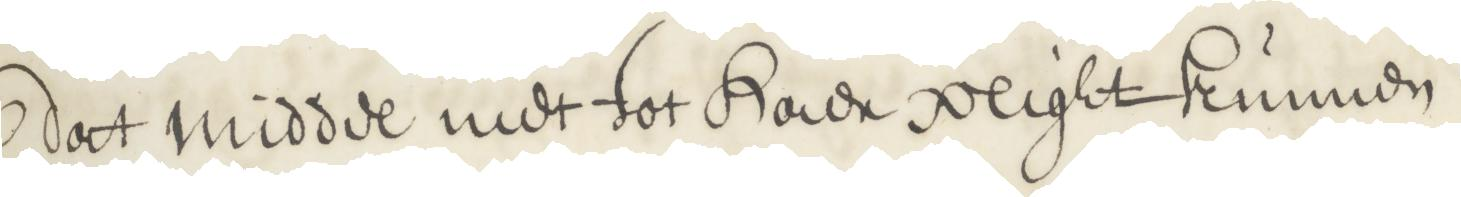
dat middel niet tot haer plight kunnen
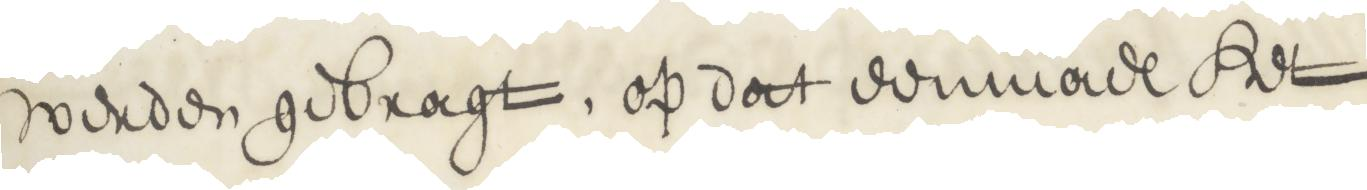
werden gebragt, op dat eenmael het
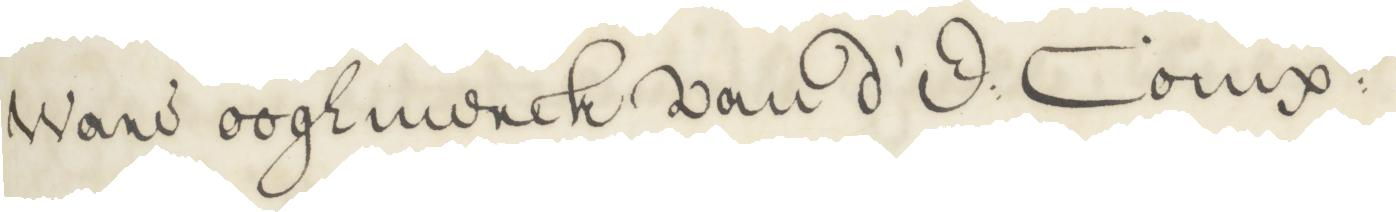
ware ooghmerck van d’ E: Comp:
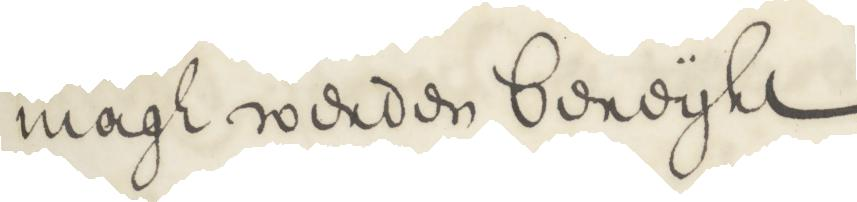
magh werden bereijkt
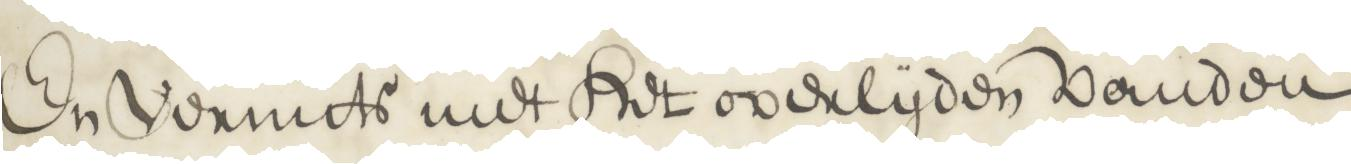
En vermits met het overlijden vanden
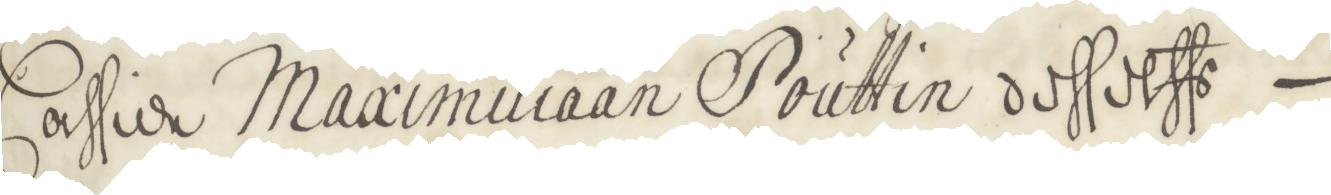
Cassier Maximiliaan Pouttin desselffs –
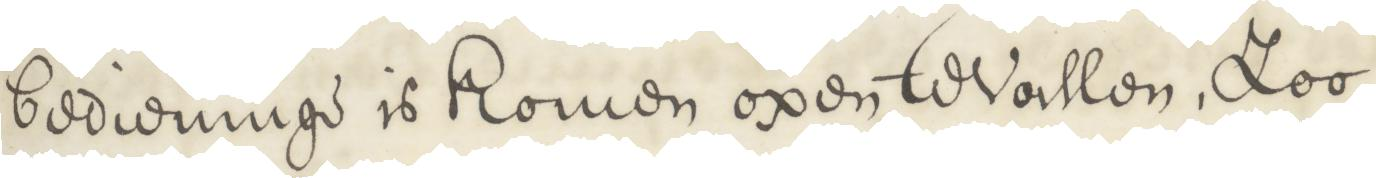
bedieninge is komen open tevallen, zoo
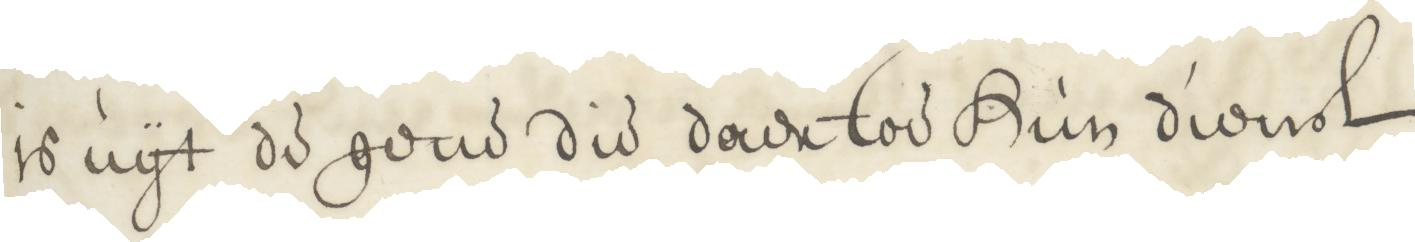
is uijt de gene die daertoe hun dienst
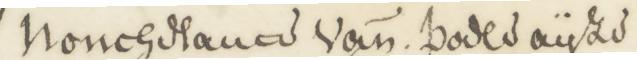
Nonchelance van. poele aijze
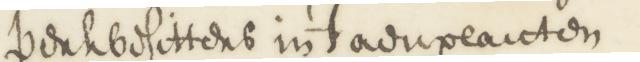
Perkbesitters in ’t aenplanten
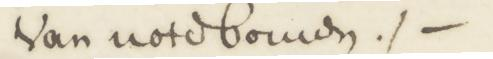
van notebomen. / –
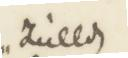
„zullen
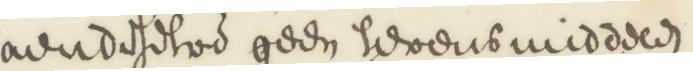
aen deselve geen levensmiddelen
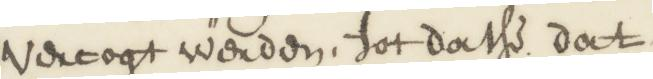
vercogt werden, tot datse dat
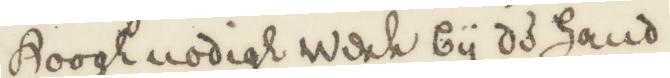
Hoogh nodigh werk bij de hand
